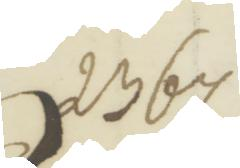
2367
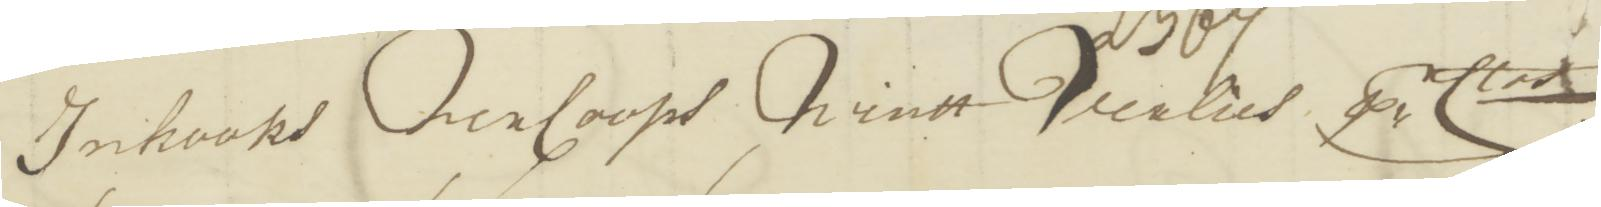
Jnkoops Vercoops Winst verlies p„rC—tos
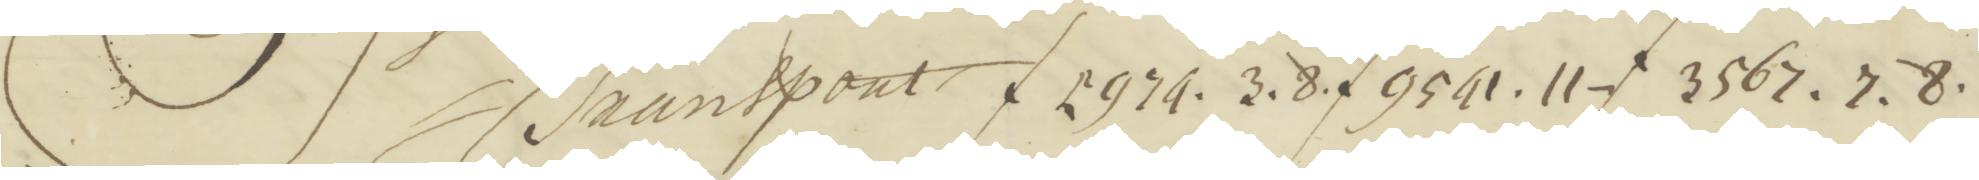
P=r Transport ƒ5974. 3. 8. ƒ9541.11 –ƒ 3567. 7. 8.
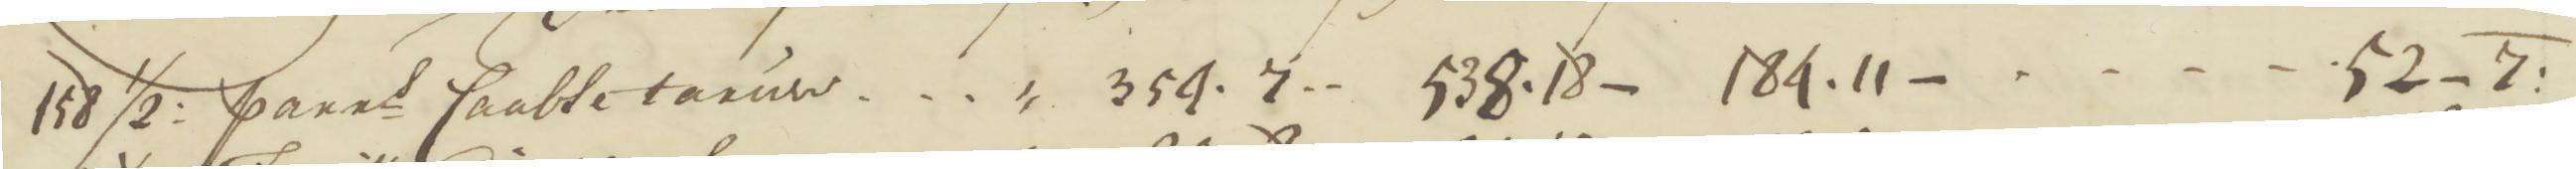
158 ½: parr=s Caabse taruw - - - „ 354. 7 - - 538.18– 184.11– - - – – .52– 7:
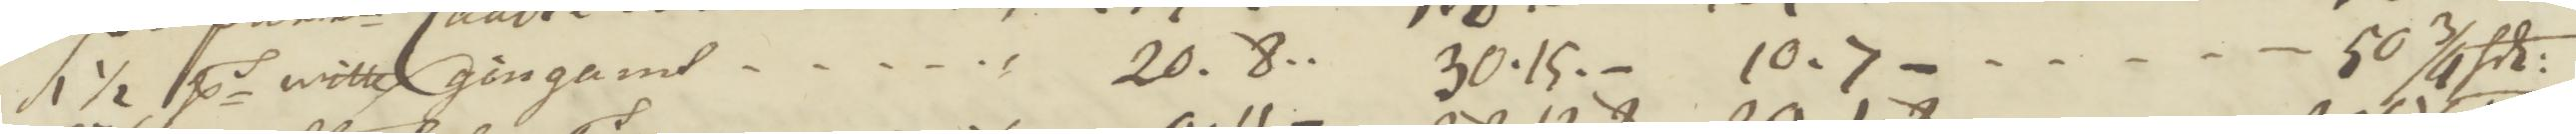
1½ p=s witte gingams - - - - - „ 20. 8. . 30. 15.– 10. 7 – - - - - - - 50¾ sch:
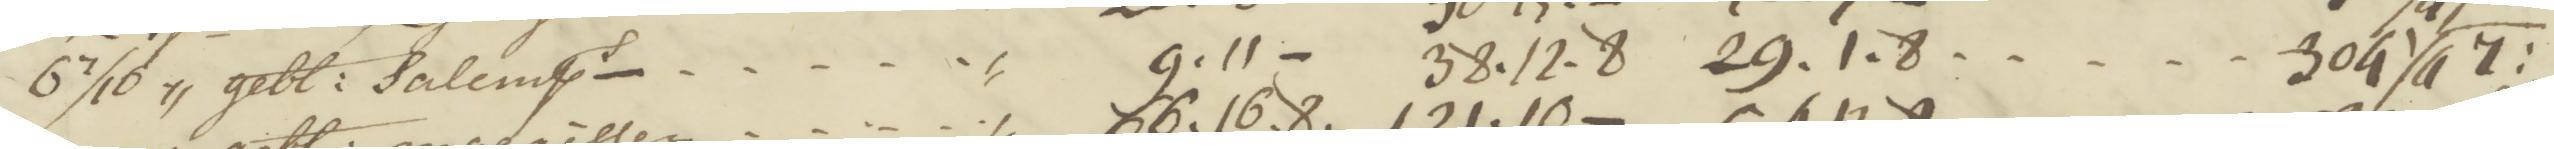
6 7/16 „ gebl: salemp–s - - - - - „ 9. 11 – 38. 12. 8 29. 1. 8 - - - - - -304¼ 7:
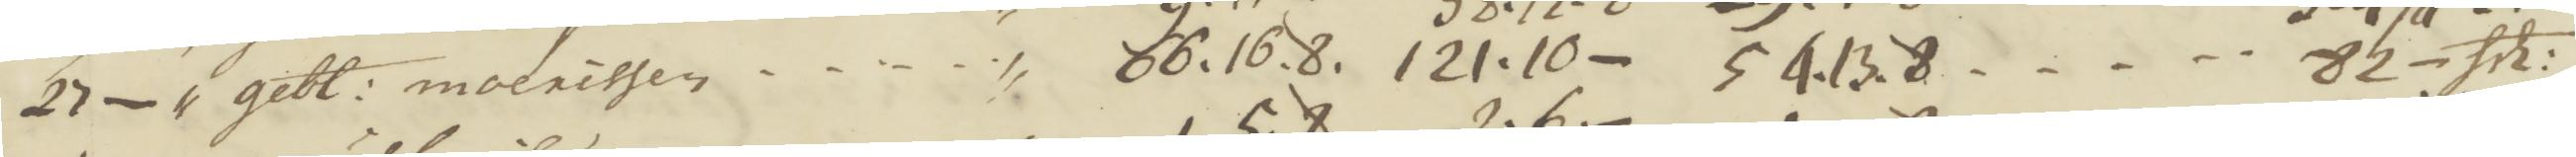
27 — „ gebl: moerissen - - . - - . „ 66. 16. 8. 121. 10– 54. 13. 8 - - - - - 82 – sch:
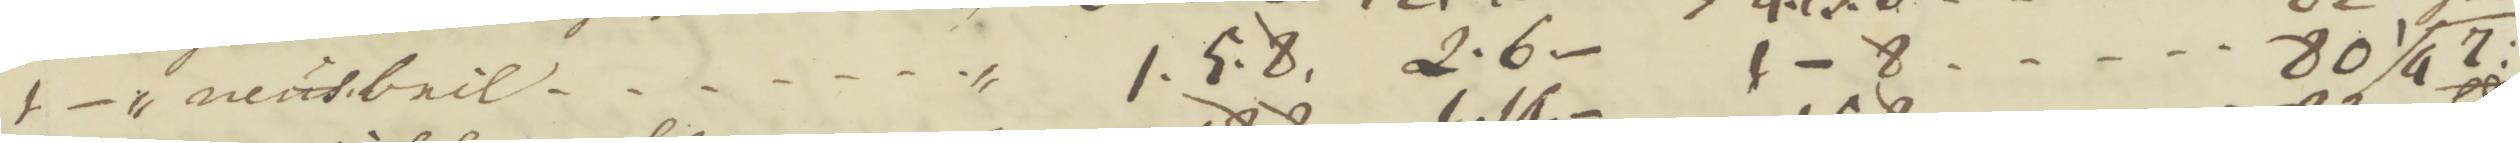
1 — „ neusbril - - - - - - - „ 1. 5. 8. 2. 6 .– 1 – 8 - - - - - 80¼ 7
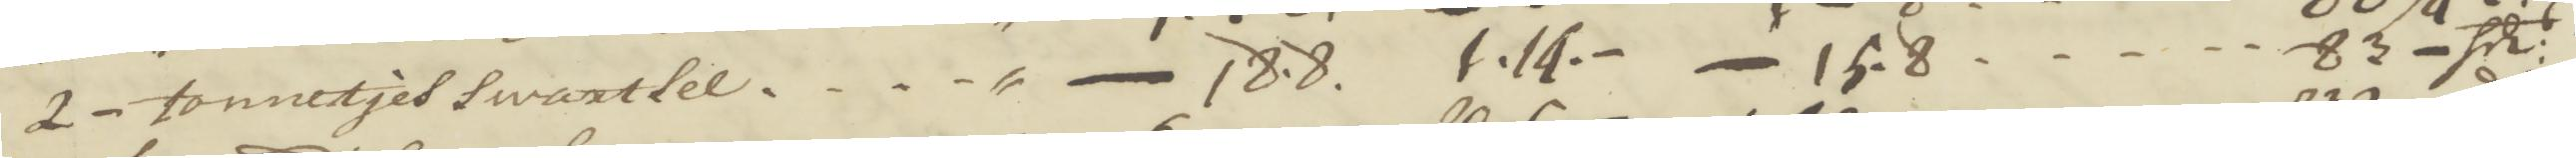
2 – tonnetjes swartsel - - - - „ — 18. 8. 1.14. – — 15. 8 - - - - - 83 – sch:s
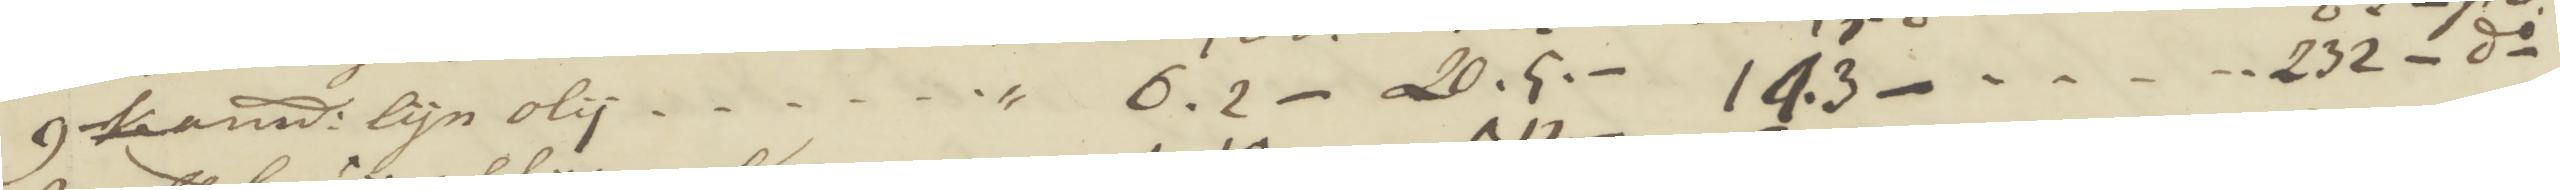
9 – kann: lijn olij - - - - - - „ 6. 2 — 20. 5. – 14. 3 – - - - - - 232 – d–o
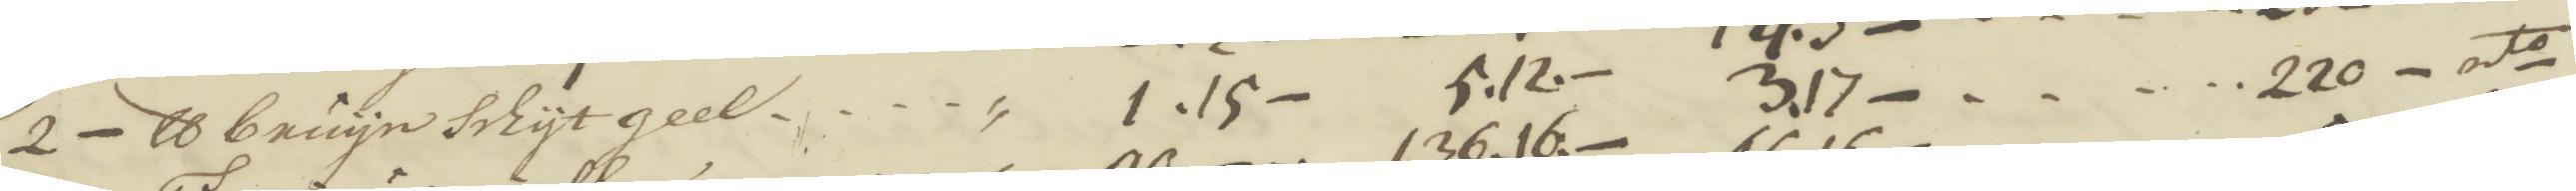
2 – lb bruijn schijt geel - - - - „ 1. 15 – 5.12.– 3.17 – - - - . - . 220 – d–to
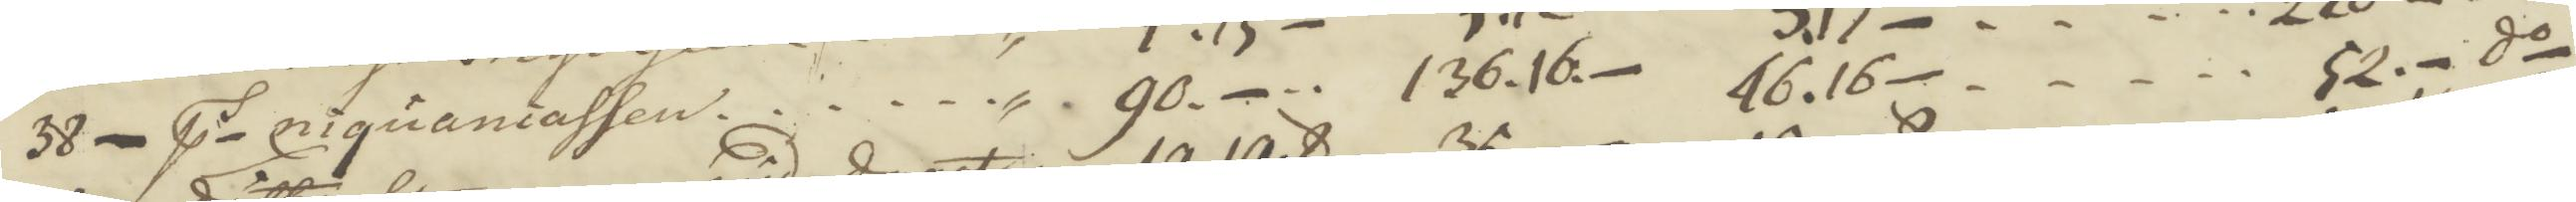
38 – p–s niquaniassen . . . - - . „ 90. – - . 136. 16:– 46. 16– - - - - - 52.– d–o
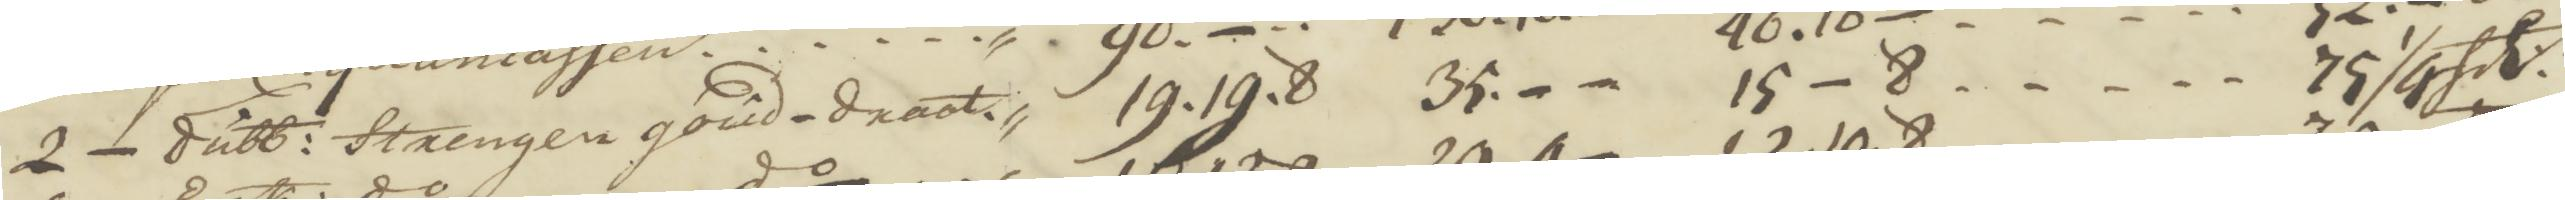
2 — dutb: strengen goud-draat.„ 19. 19.8 35. – – 15 – 8 - - - - - 75¼ sch:
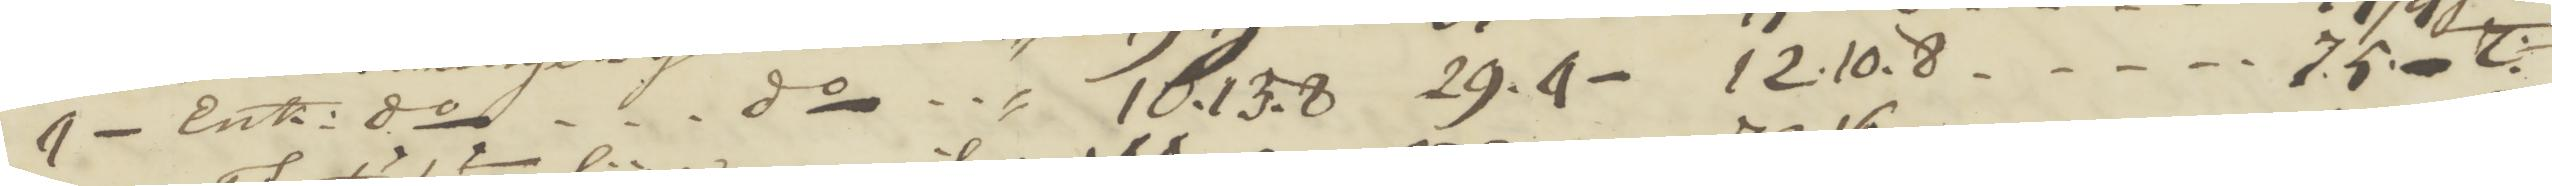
4 — Enk: d–o - - - d–o - - „ 16.13.8 29. 4 – 12.10.8 - - – – - 7.5.– r:
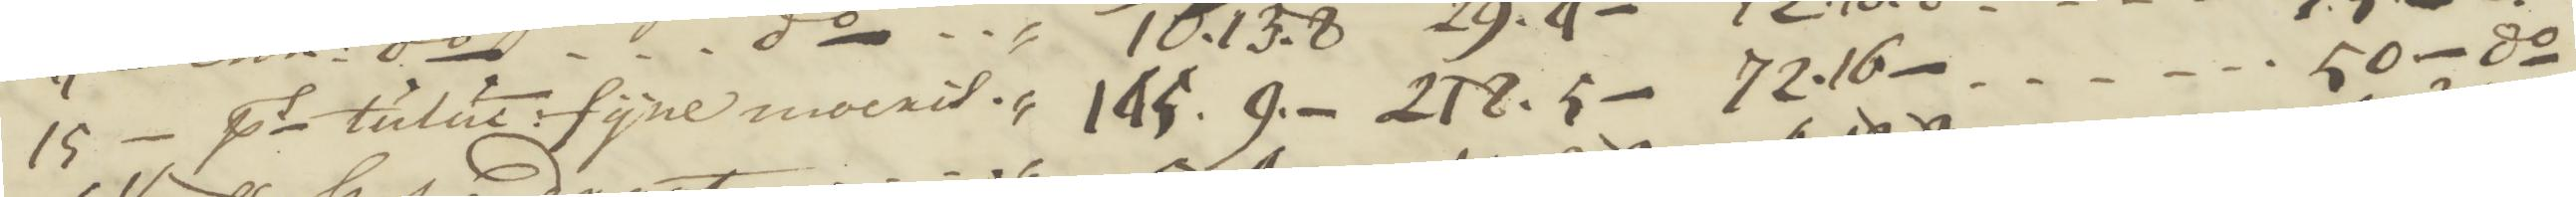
15 — p–s tutuc: fijne moeris . „ 145. 9.– 218. 5– 72.16– - - - – – . 50 — d–o
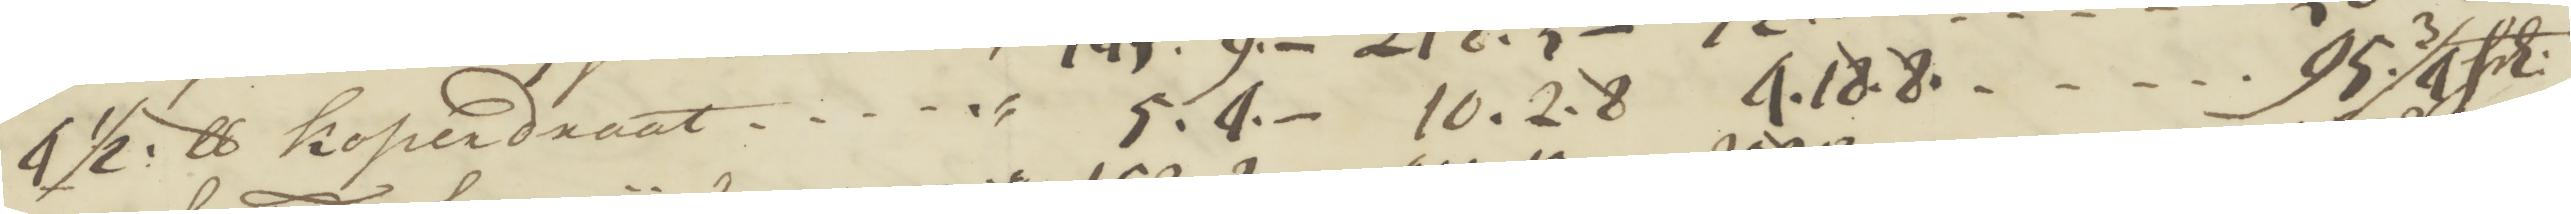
4½: lb koperdraat - - - - - „ 5. 4.– 10. 2. 8 4.18.8. - - - - . 95.¾ sch:
